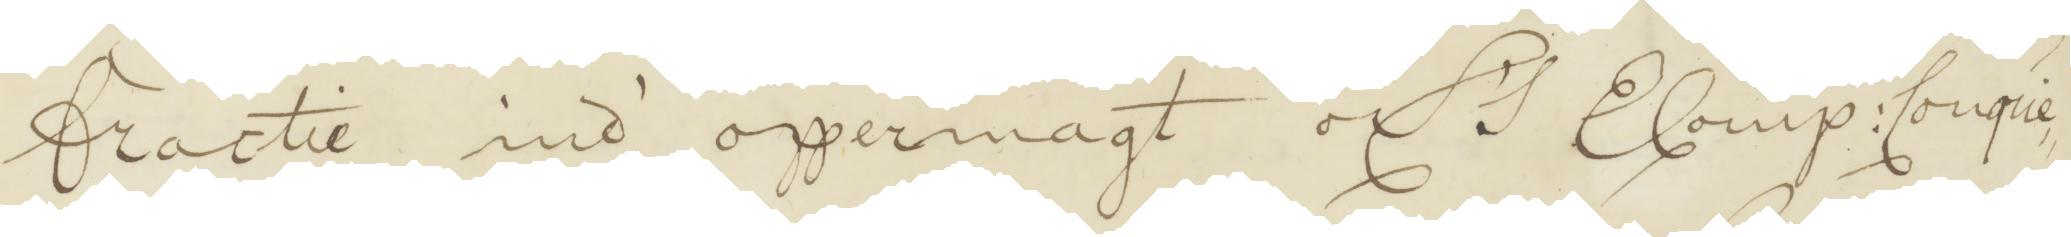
fractie ind' oppermagt over ’s EComp: Conque„
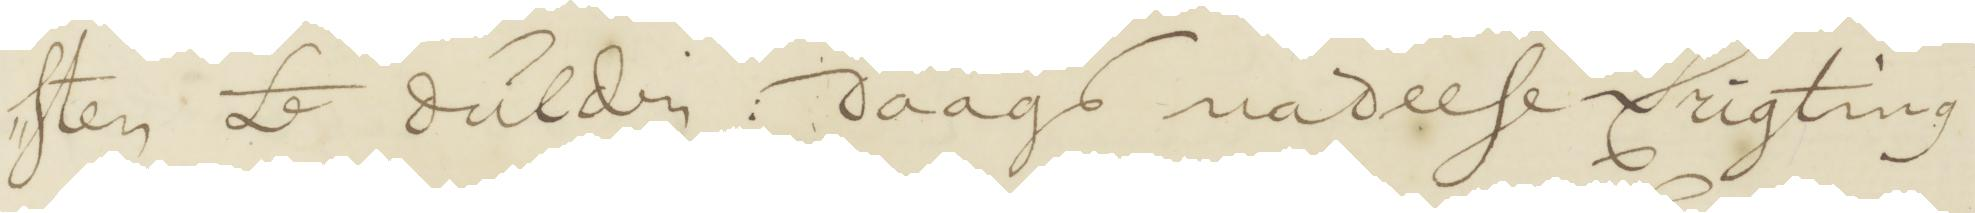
„sten te dulden: daags nadeese verrigting
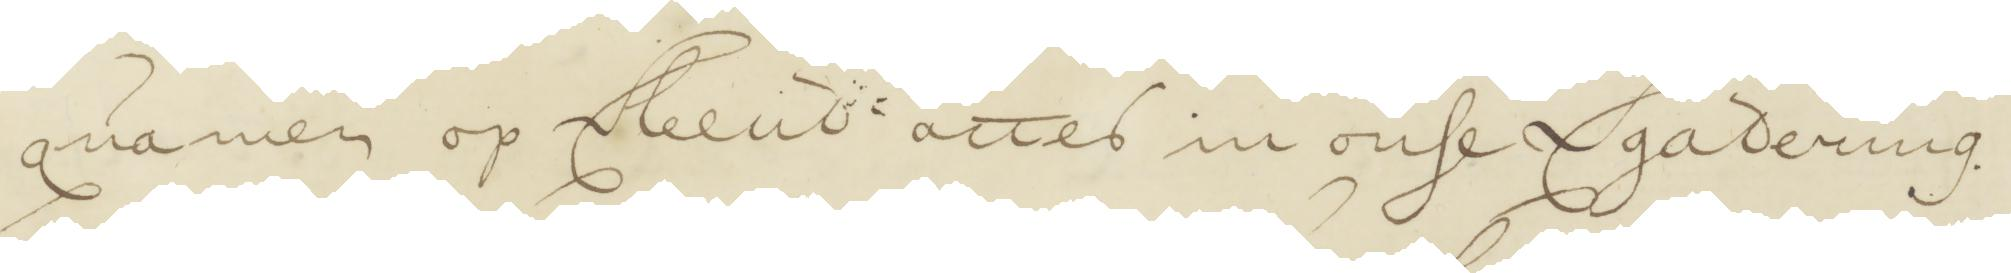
quamen op verleend acces in onse vergadering
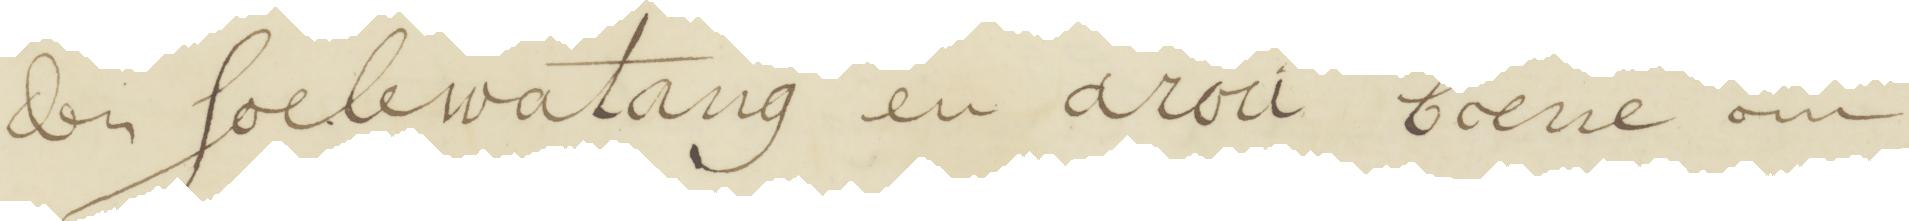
den soelewatang en arou boene om
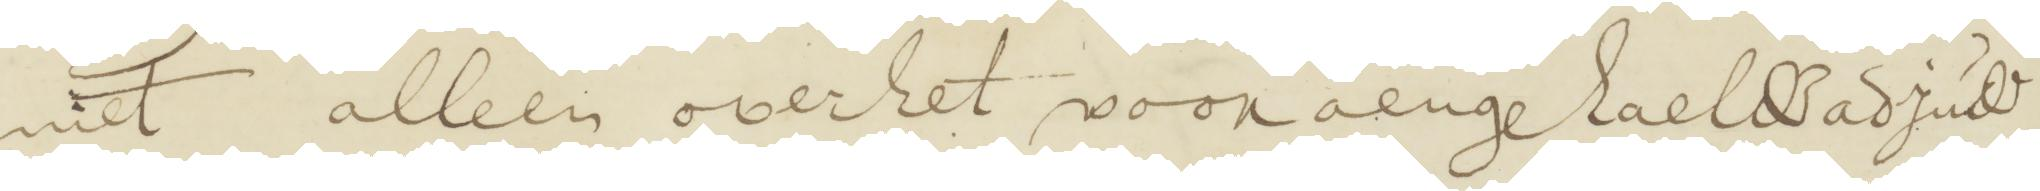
niet alleen over het voor aengehaelde adjude
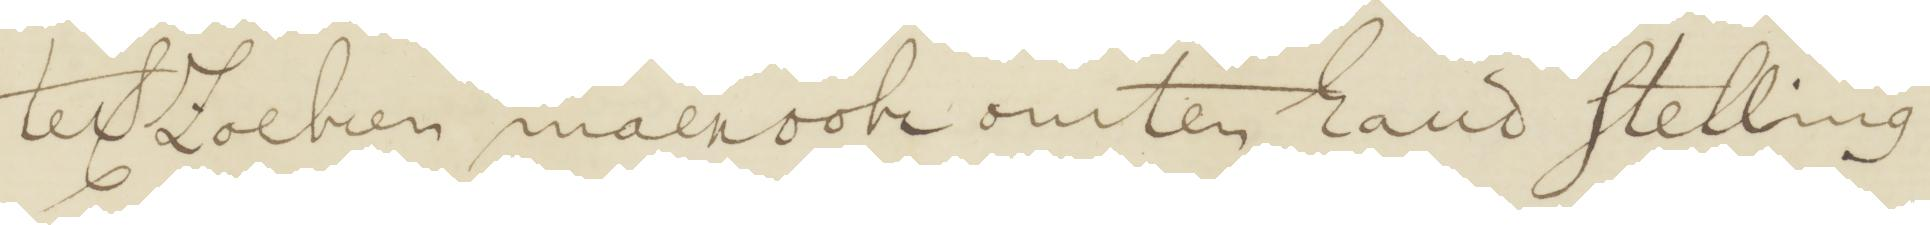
te verzoeken maer ook om ten hand stelling
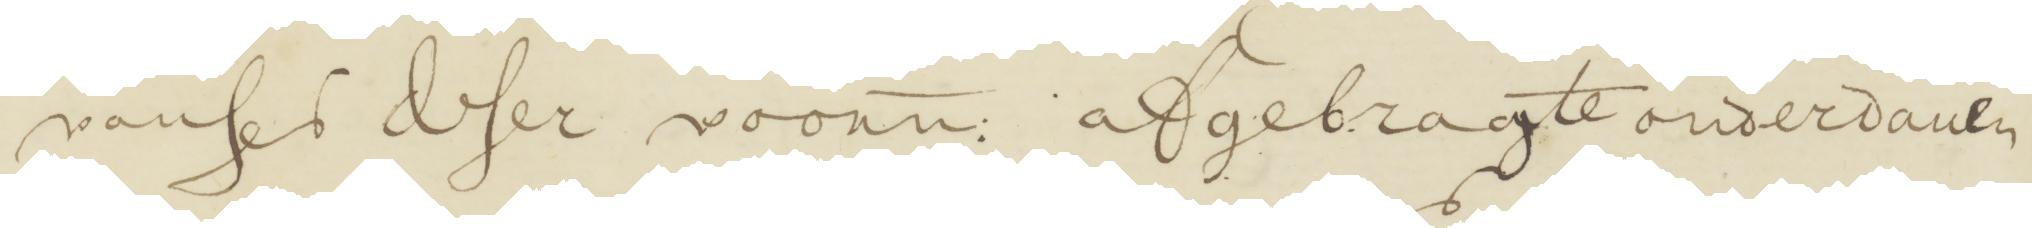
van ses deser voorn: afgebragte onderdanen
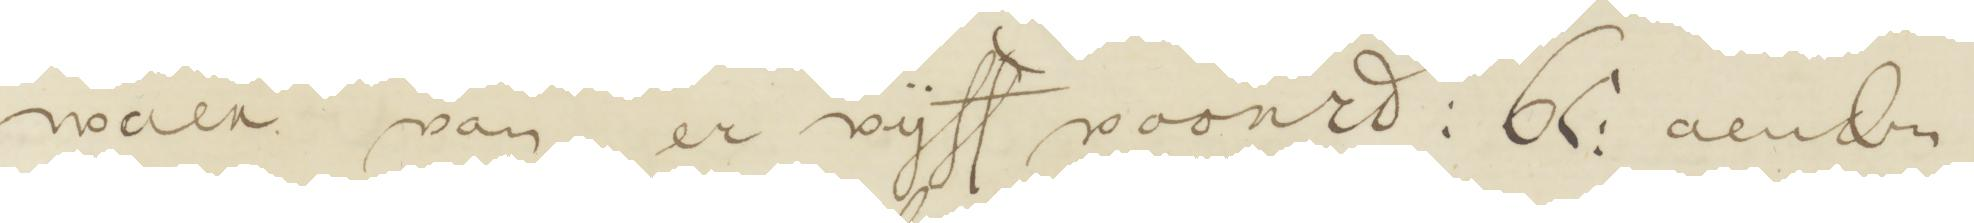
waer van er vijff voor rd:s 65: aenden
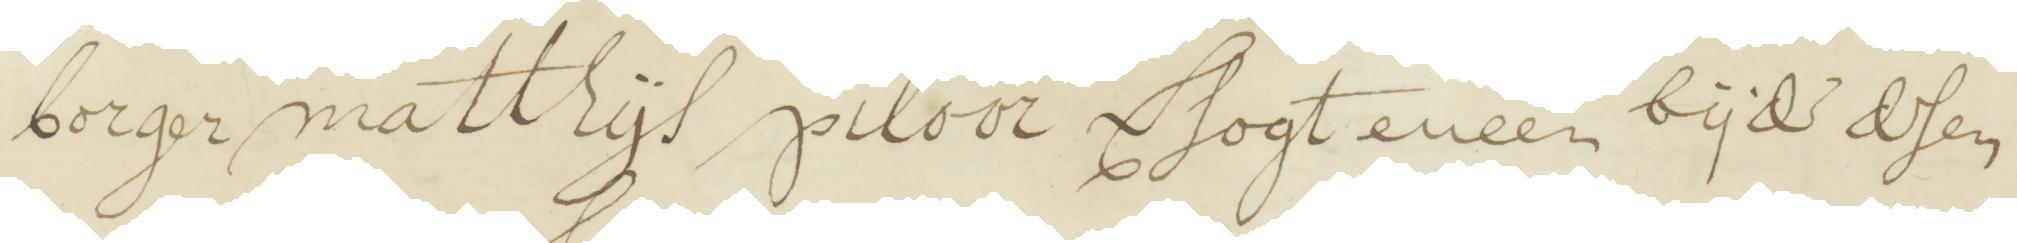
borger matthijs piloor versogt en een bijde desen
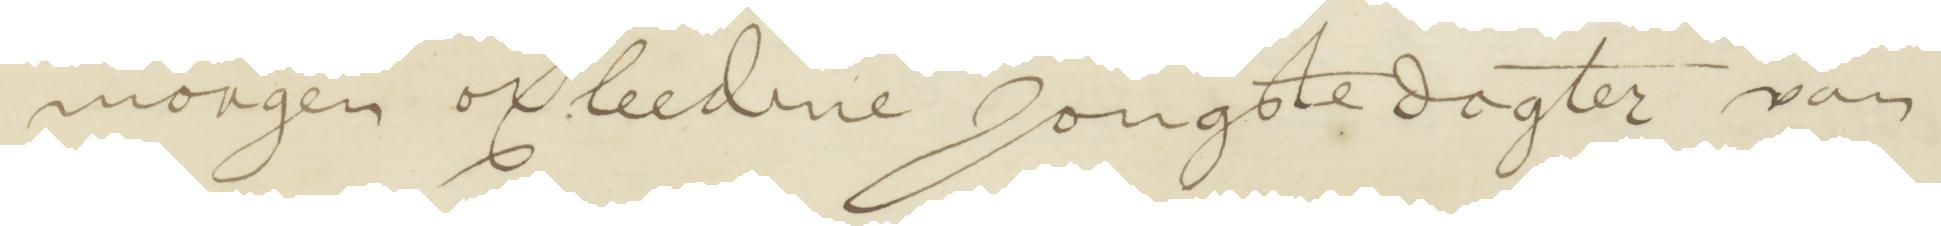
morgen overleedene jongste dogter van
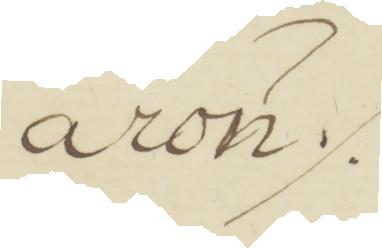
arou./.
